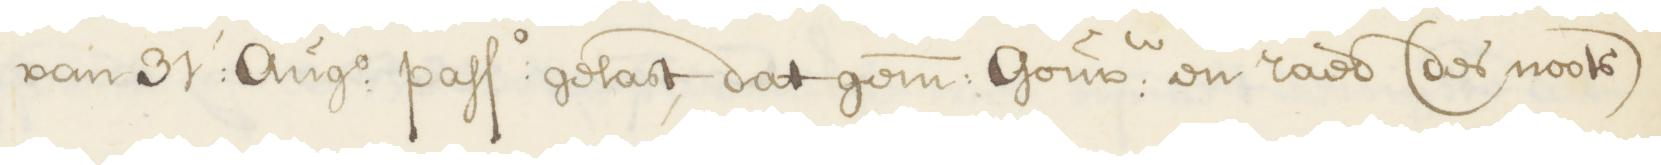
van 31: Aug:o pass:o gelast, dat gem: Gouv:r en raed (des noots)
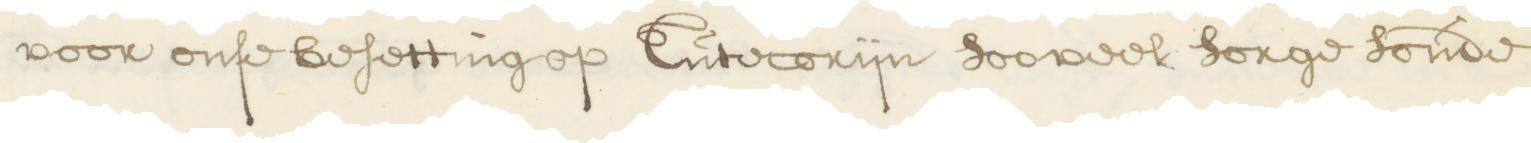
voor onse besetting op Tutecorijn sooveel sorge soude
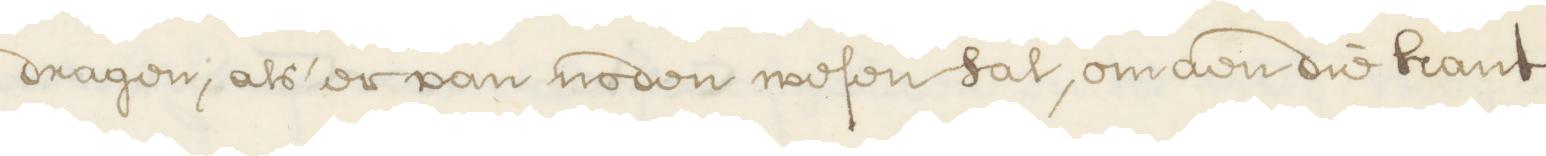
dragen, als 'er van noden wesen sal, om aen die kant
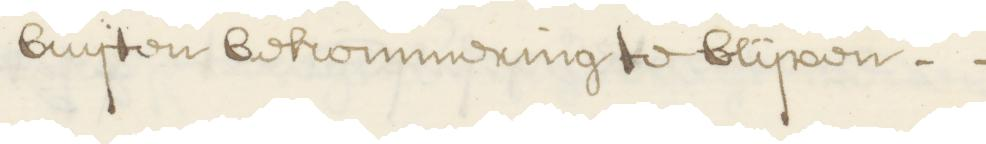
buijten bekommering te blijven.
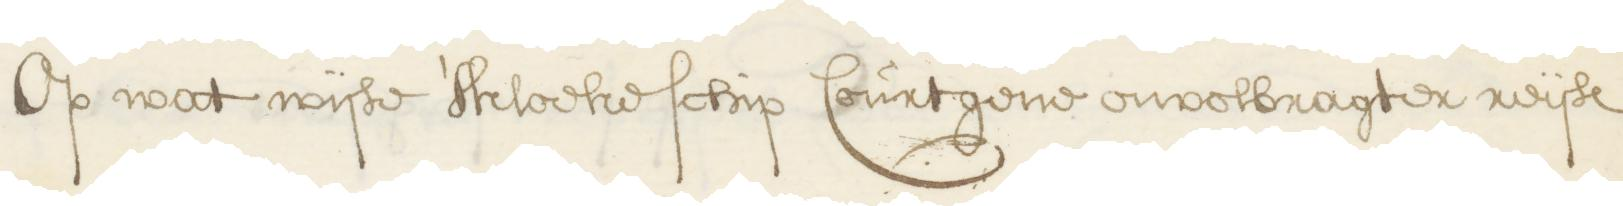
Op wat wijse ’skloeke schip Courtgene onvolbragter reijse
